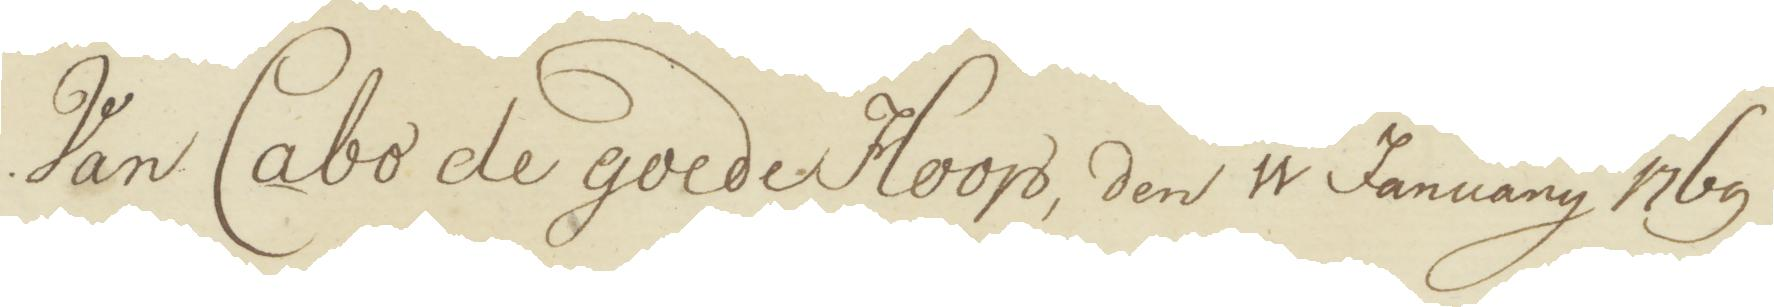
Van Cabo de goede Hoop, den 11 Ianuarij 1769
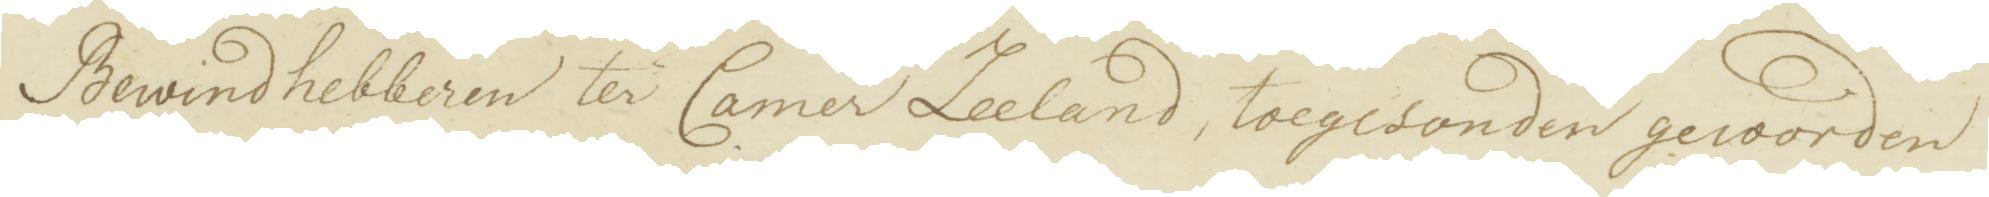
Bewind hebberen ter Camer Zeeland, toegesonden geworden
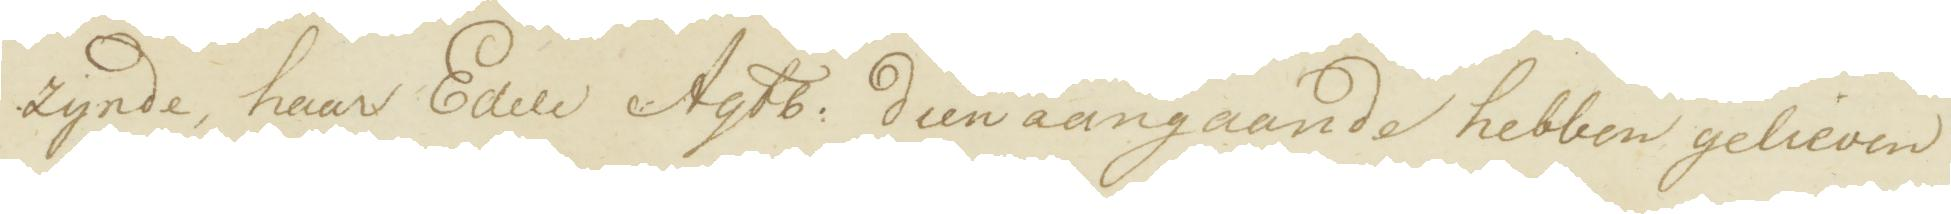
zijnde, haar Edele Agtb: dien aangaande hebben gelieven
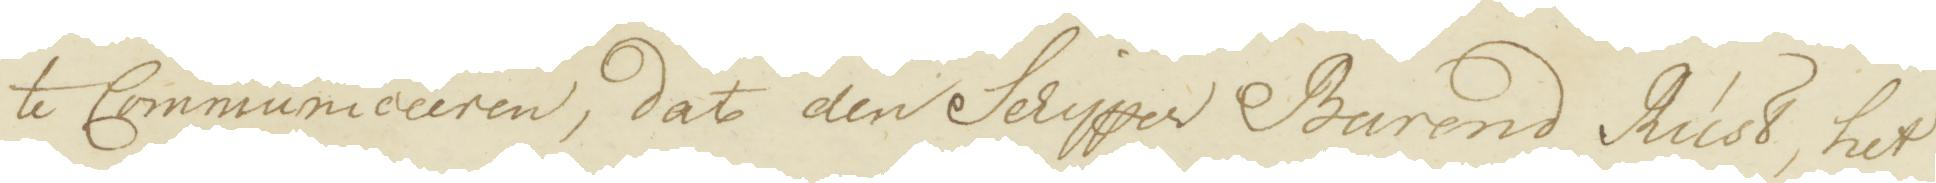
te Communiceeren, dat den schipper Barend Rust, het
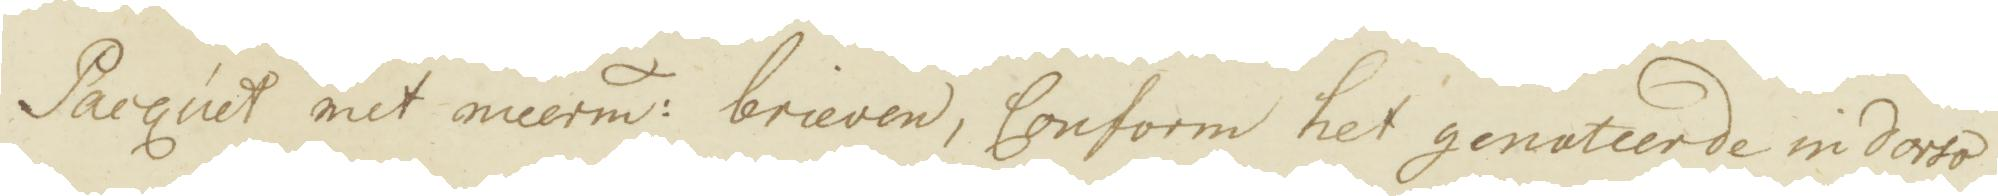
Pacquet met meerm: brieven, Conform het genoteerde in dorso
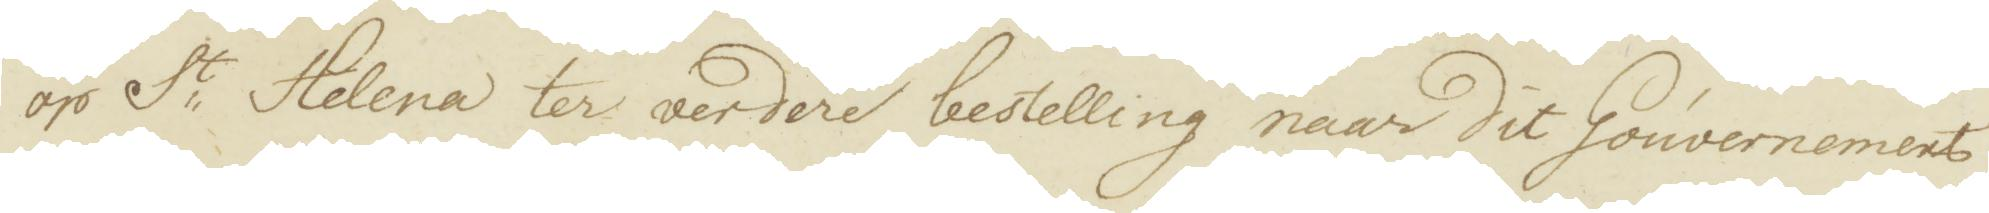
op S„t Helena ter verdere bestelling naar dit Gouvernement
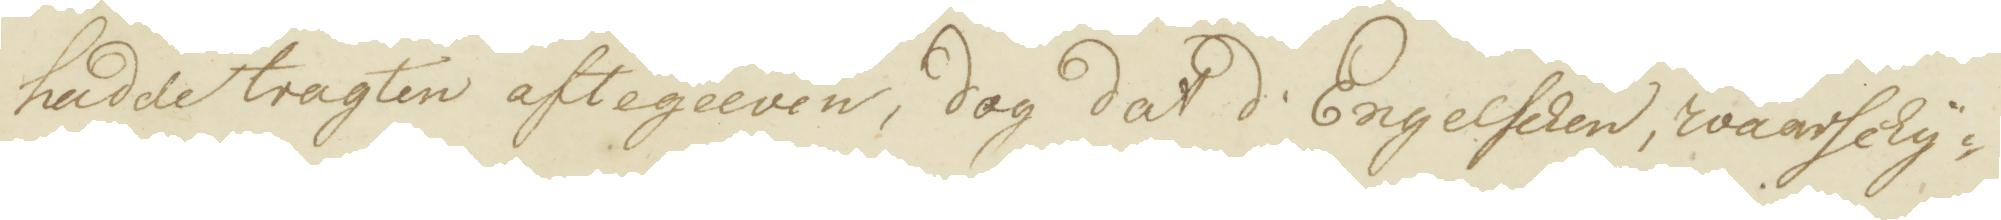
hadde tragten aftegeeven, dog dat d’ Engelschen, waarschij„
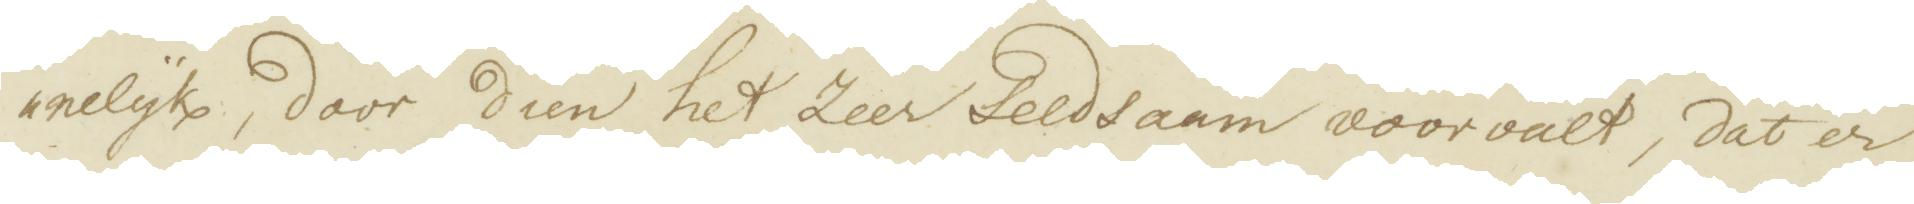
nelijk, door dien het zeer zeldsaam voorvalt, dat er
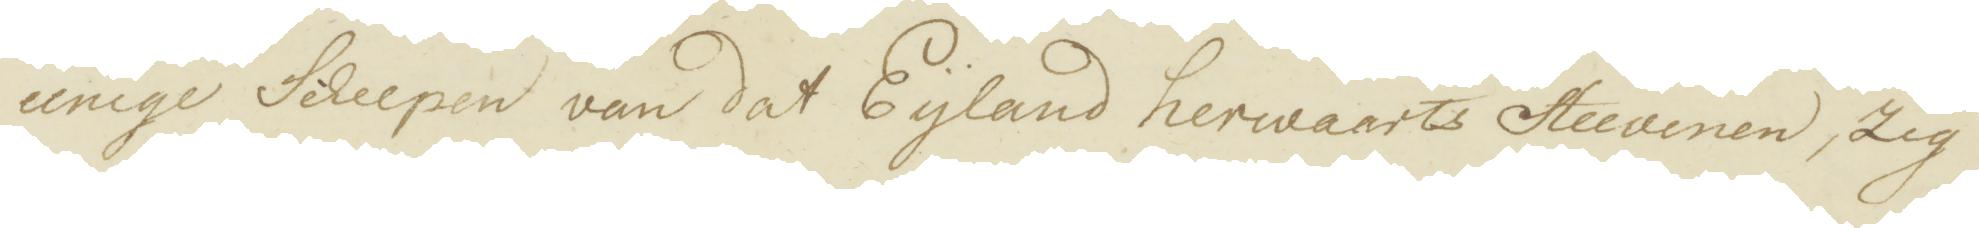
eenige scheepen van dat Eijland herwaarts steevenen, zig
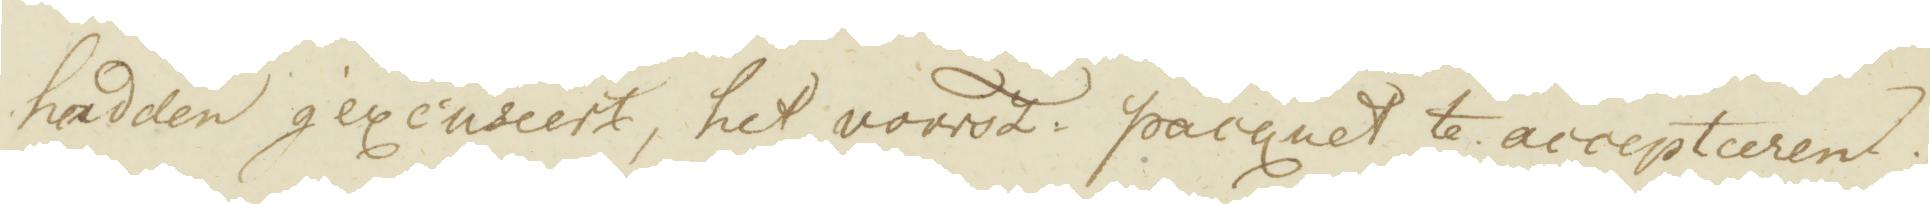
hadden g’excuseert, het voorsz: pacquet te accepteeren
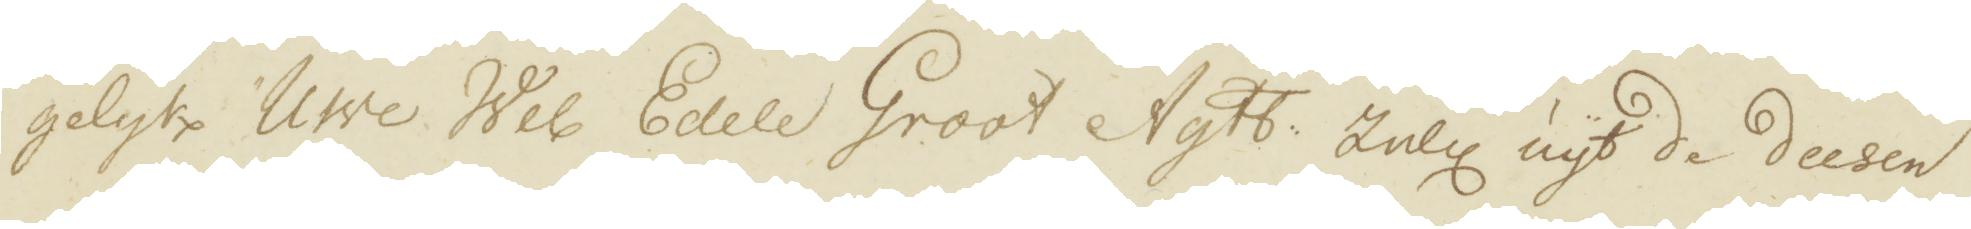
gelijk Uwe: Wel Edele Groot Agtb: zulx uijt de deesen
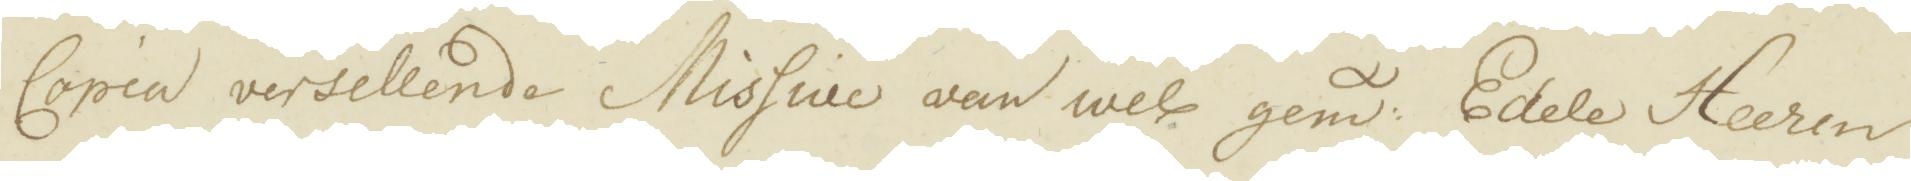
Copia versellende Missive van wel gem: Edele Heeren
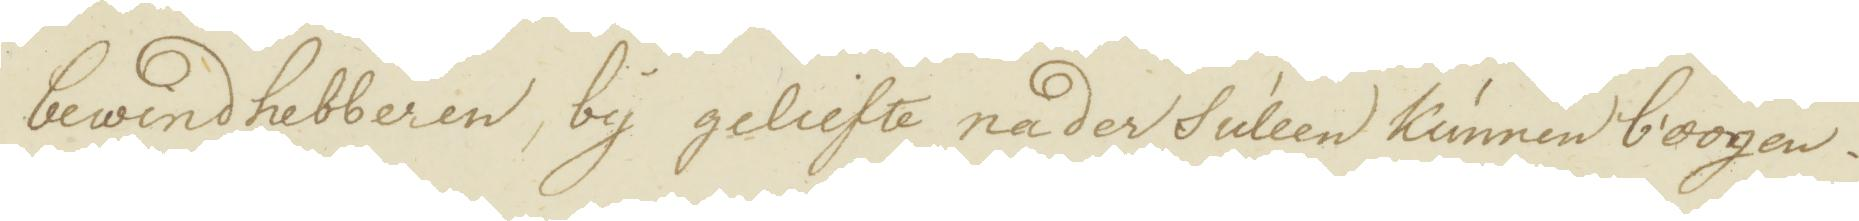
bewind hebberen, bij geliefte na der sullen kunnen b'oogen
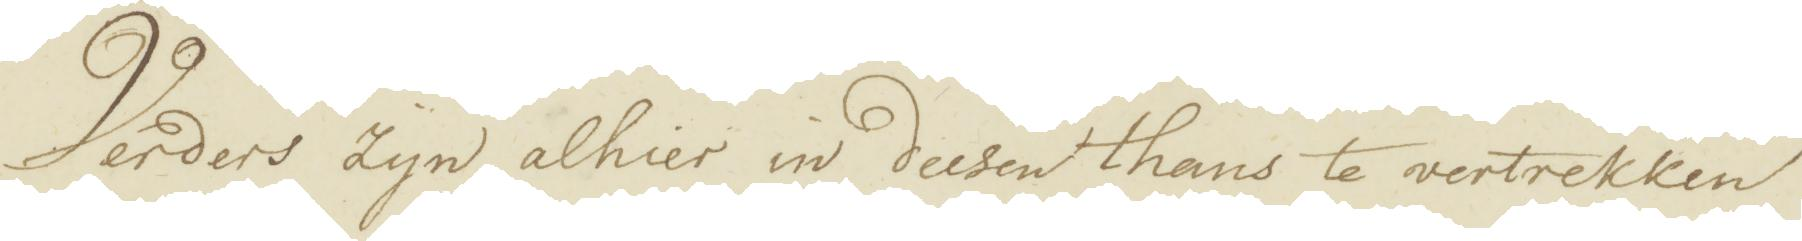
Verders zijn alhier in deesen thans te vertrekken
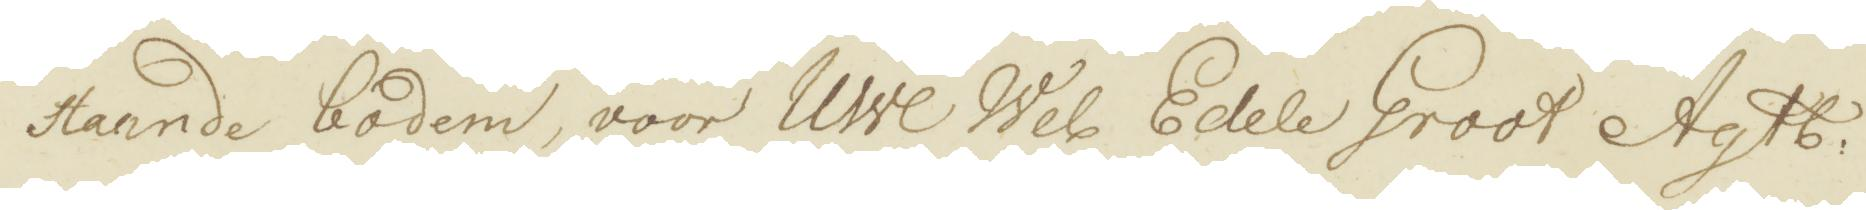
staande bodem, voor Uwe Wel Edele Groot Agtb:
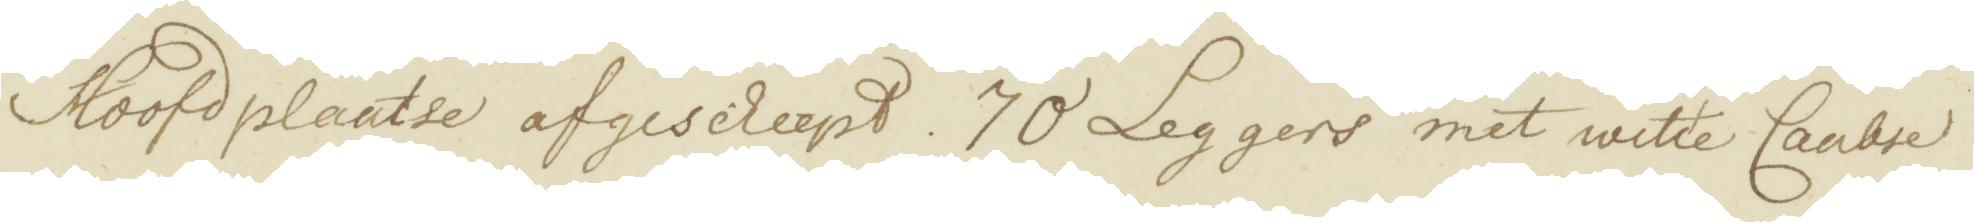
Hoofdplaatse afgescheept. 70 Leggers met witte Caabse
